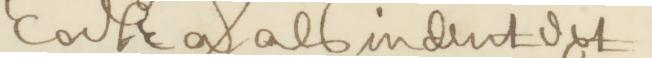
hoek over als in dentext
